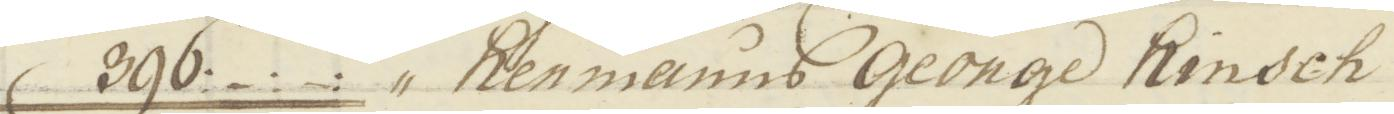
396:—: „ hermanus george hinsch
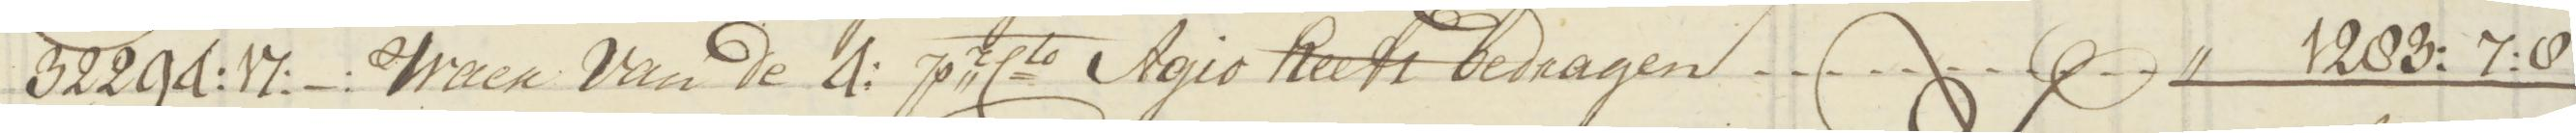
32294: 17:—: waer van de 4: p„r C=to Agio heeft bedragen -----------„ 1283: 7:8
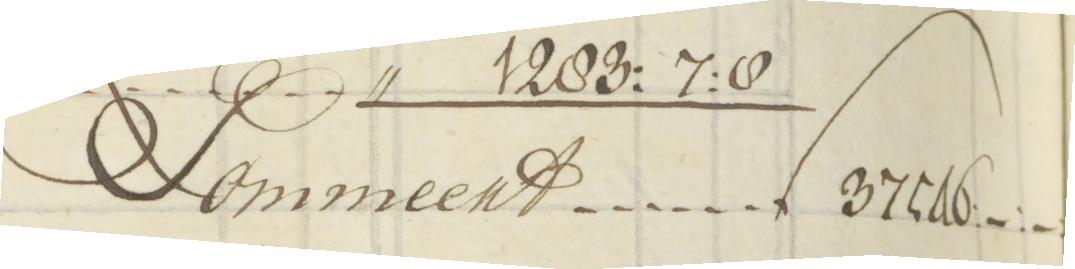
Sommeert ------ ƒ 37546:-:-
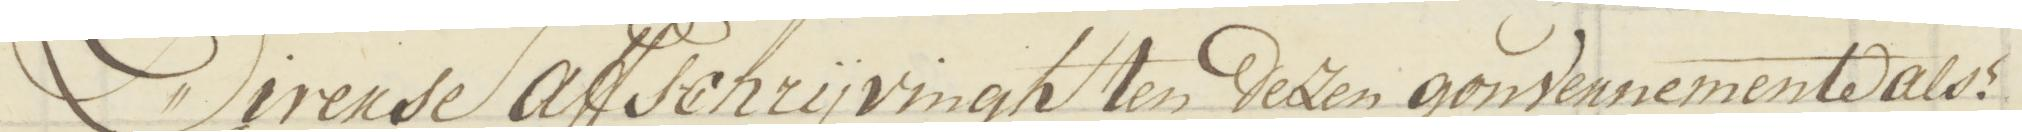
Diverse afschrijvingh ten dezen gouvernemente als:
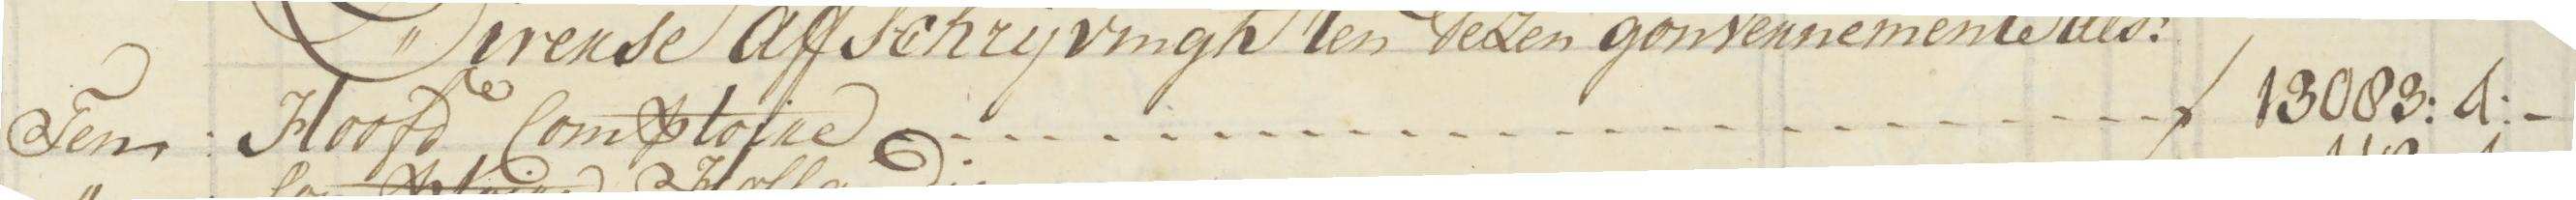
Ten : Hoofd Comptoire - - - - - - - - - - - - - - - - - - - - - - - - - ƒ 13083: 4: —
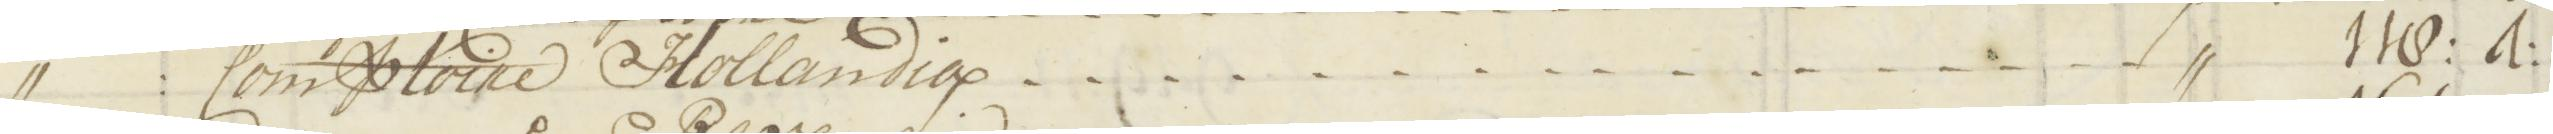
„ Comptoire Hollandia - - - - - - - - - - - - - - - - - „ 118: 4:
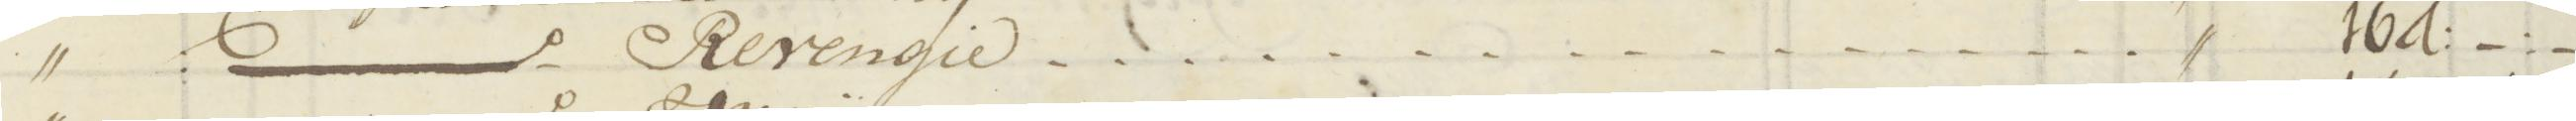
„ __o Revengie - - . . - - - - - - - - - - - - . „ 164:—:—
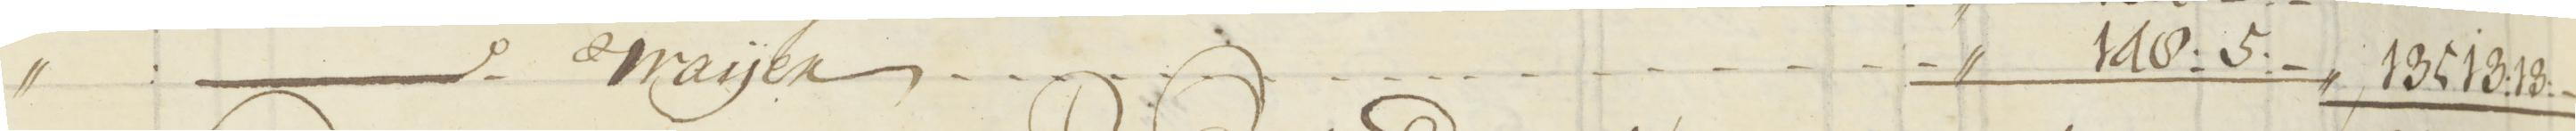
„ __o Waijer - - - - - - - - - - - - - - - - - - „ 148: 5:—„ 13513:13:-
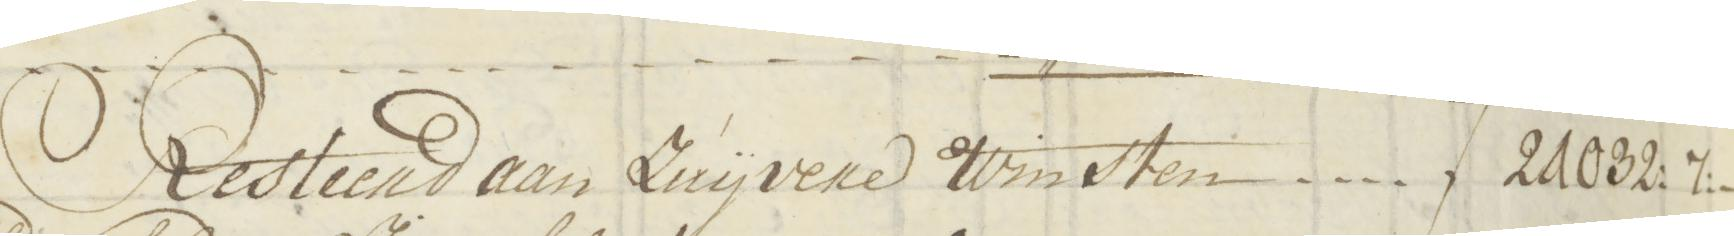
Resteerd aan zuijvere winsten - - - . ƒ 24032: 7:
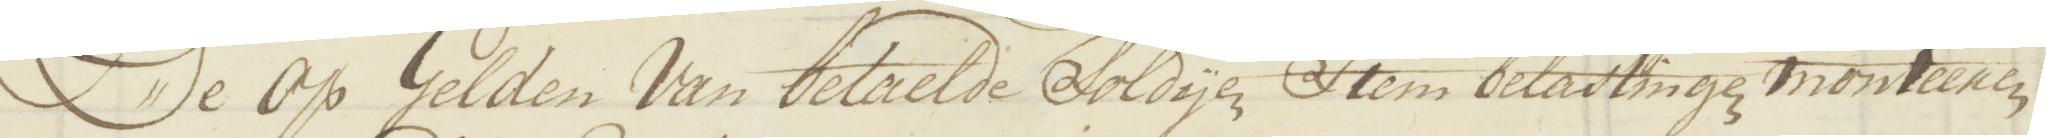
De op Gelden van betaelde soldijen Item belastingen monteeren
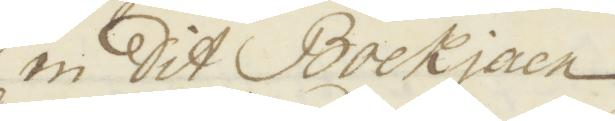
in dit Boekjaer
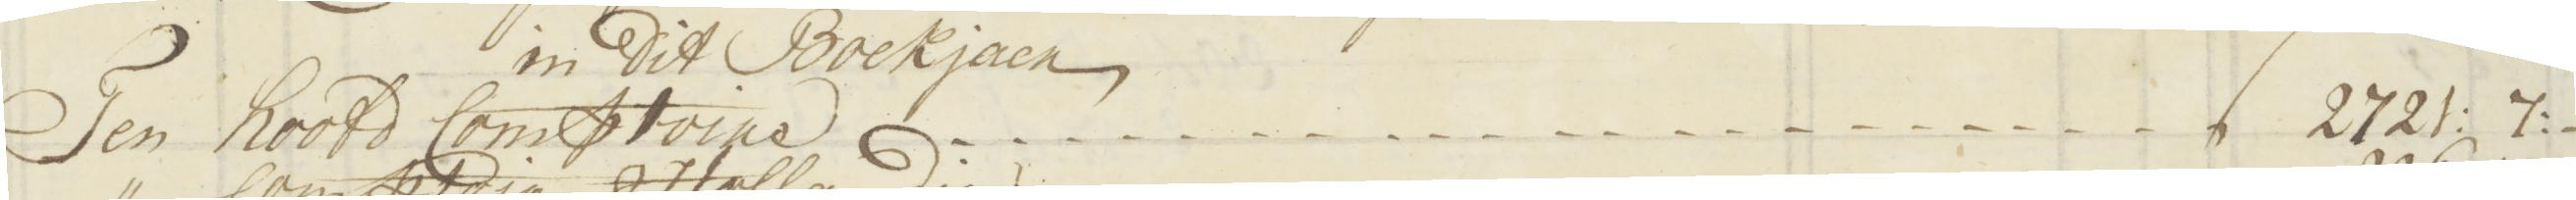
Ten hoofd Comptoire - - - - - - - - - - - - - - - - - - - - - ƒ 2721: 7:
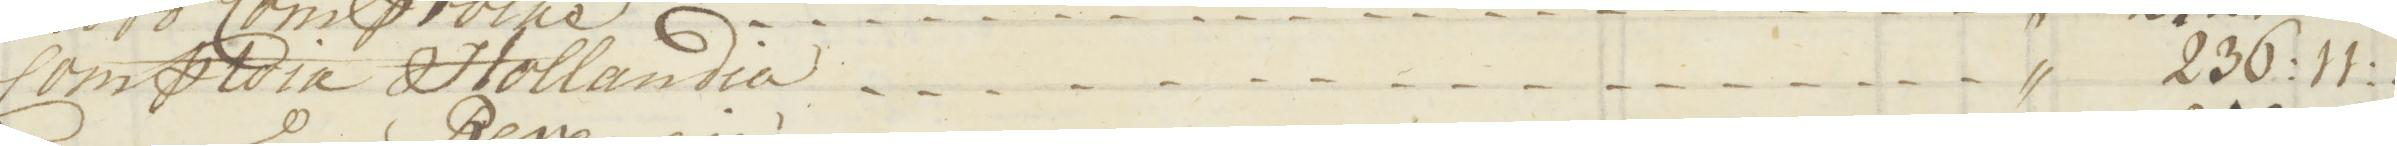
Comptoir Hollandia - - - - - - - - - - - - - - - - - - - „ 236: 11:
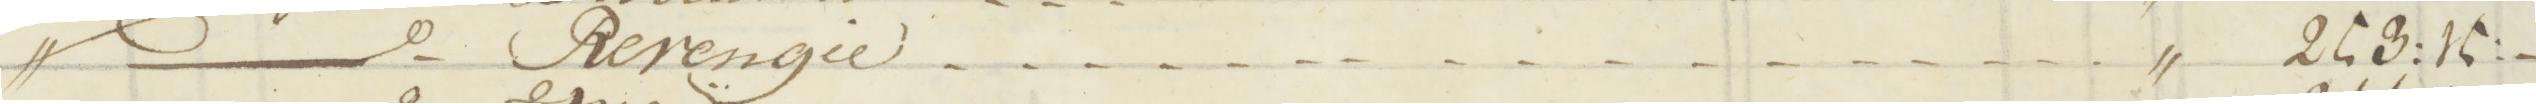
„ __o Revengie - - - - - - - - - - - - - - - - . „ 253. 15:—
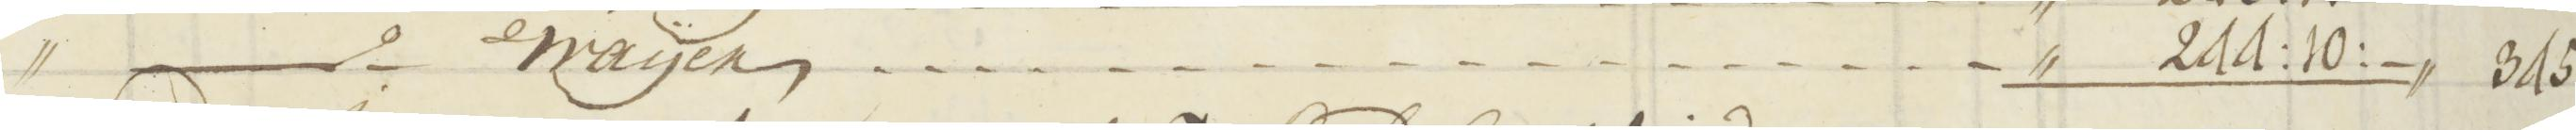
„ __o Waijer - - - . - - - - - - - - - - - - - - „ 244: 10:— „ 345
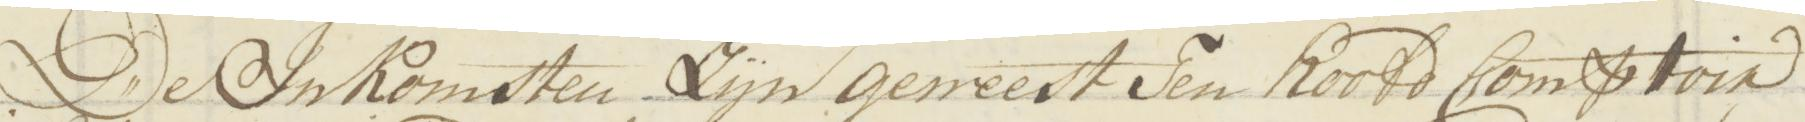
De Inkomsten zijn geweest Ten hoofd Comptoir
